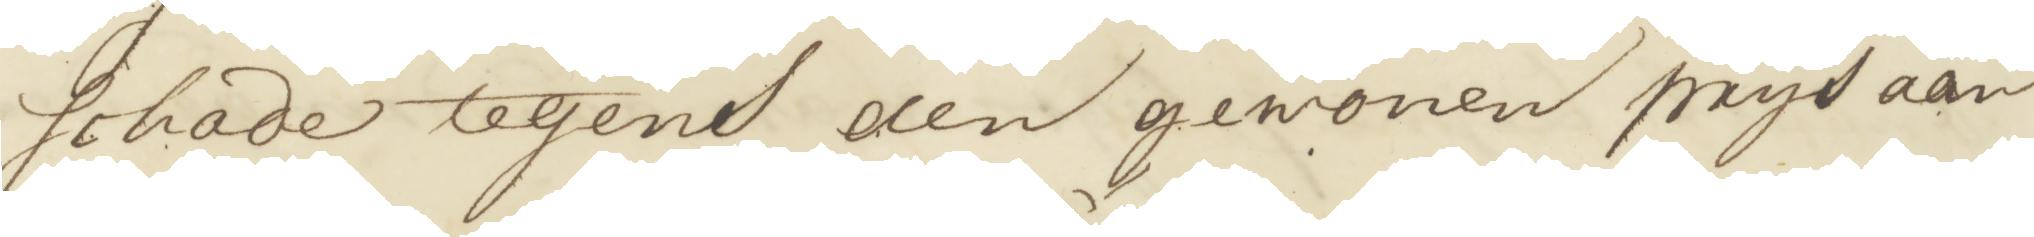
schade tegens den gewonen prijs aan
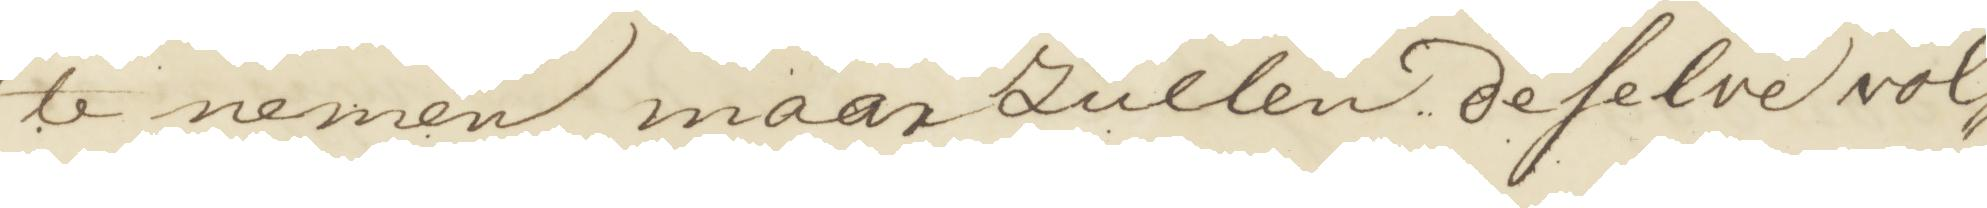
te nemen maar zullen deselve vol„
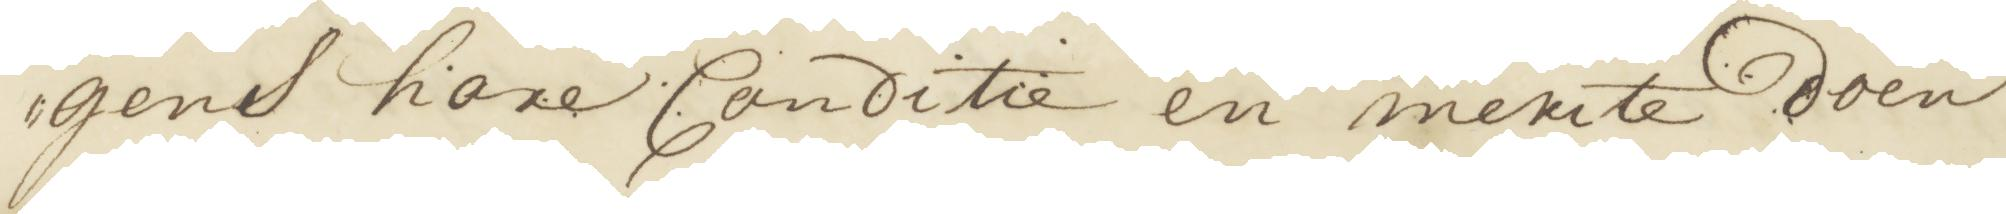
„gens hore Conditie en merite doen
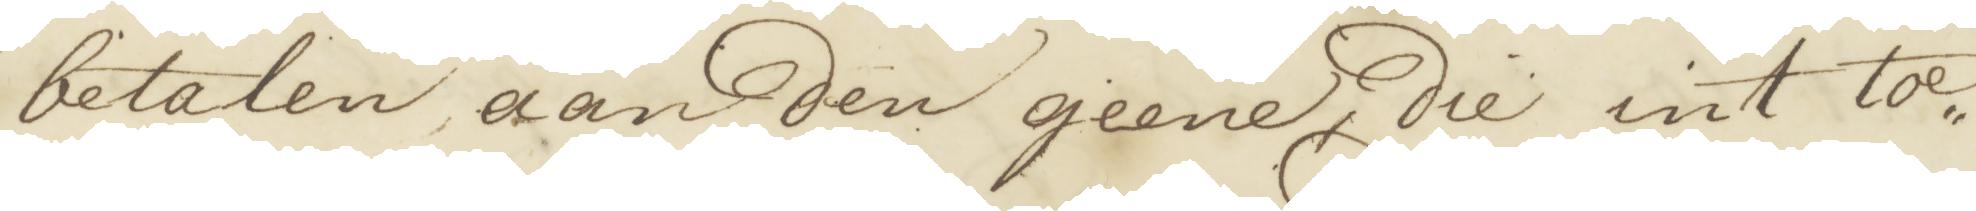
betalen, aan den geene, die in 't toe„
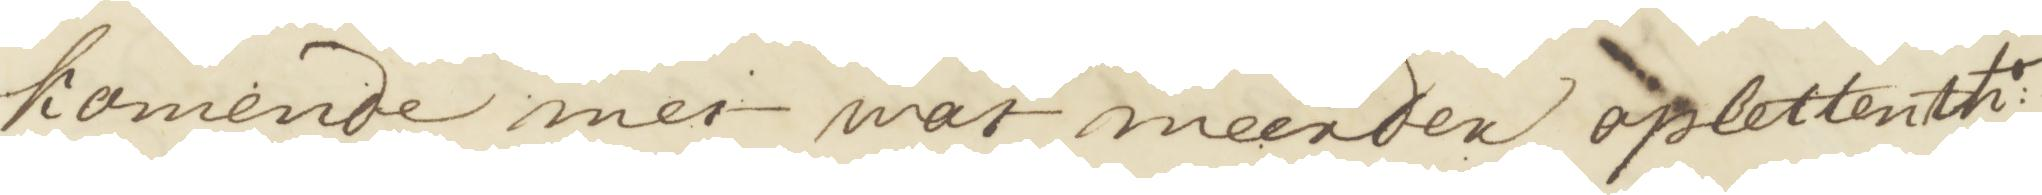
komende met wat meerder oplettenth:t
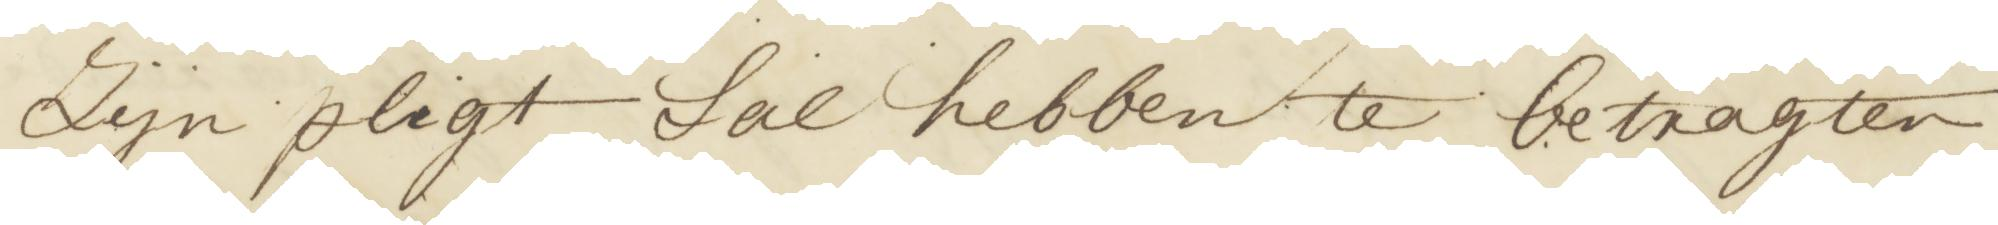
zijn pligt sal hebben te betragten
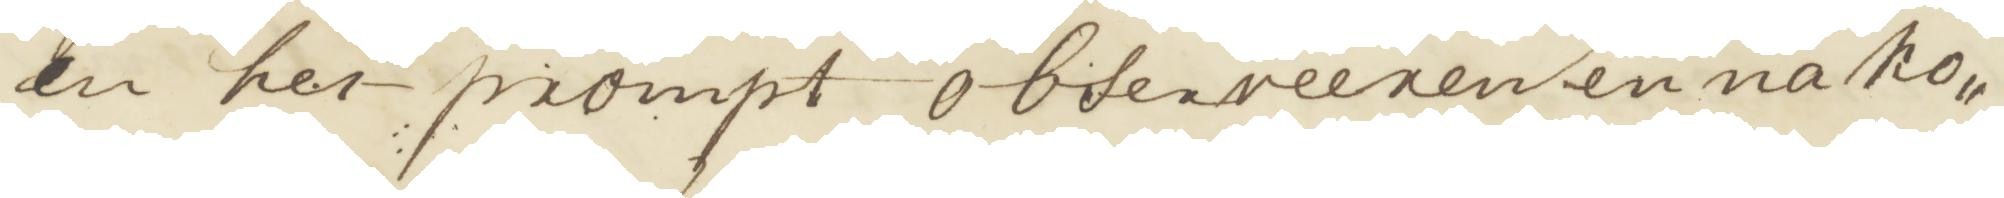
in het prompt observeeren en na ko„
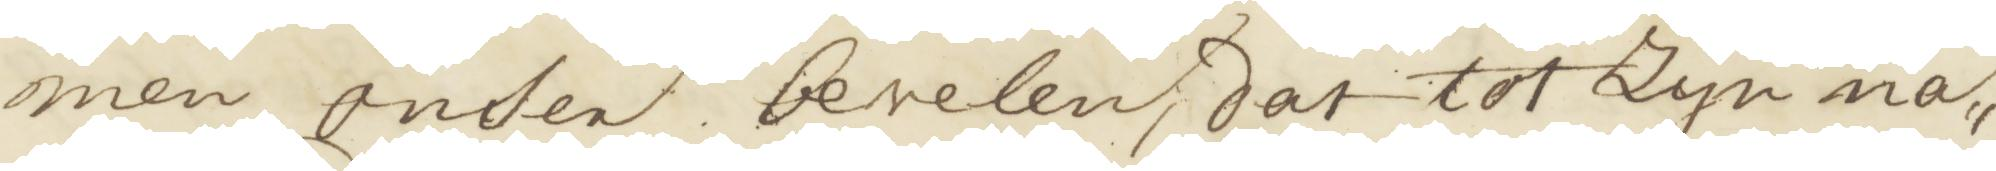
men onser bevelen, dat tot zijn na„
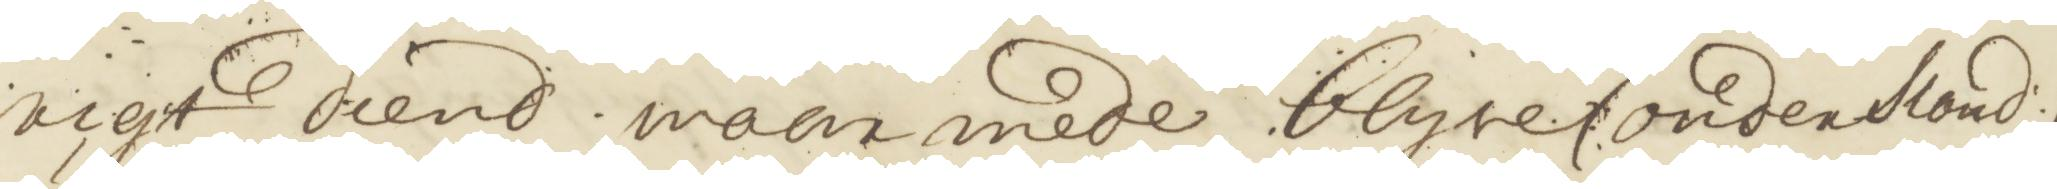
rigt diend waar mede blyve (:onderstond:
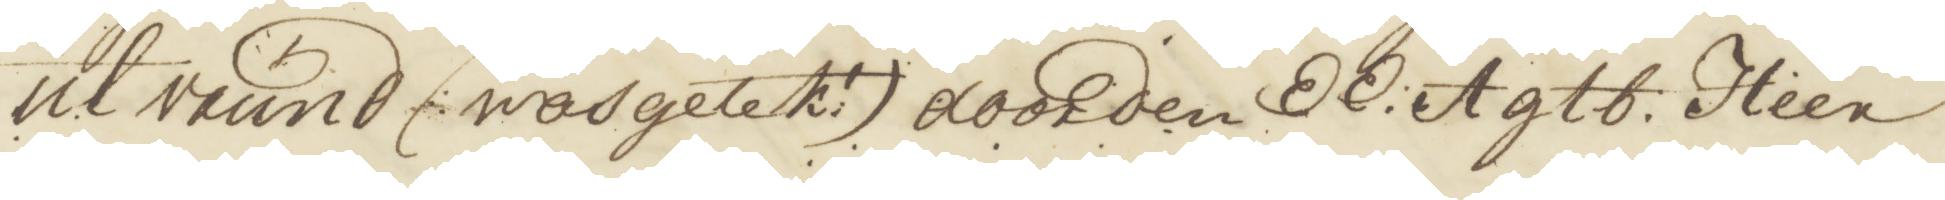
ul vrund (:was getek:t) door den EE: Agtb: Heer
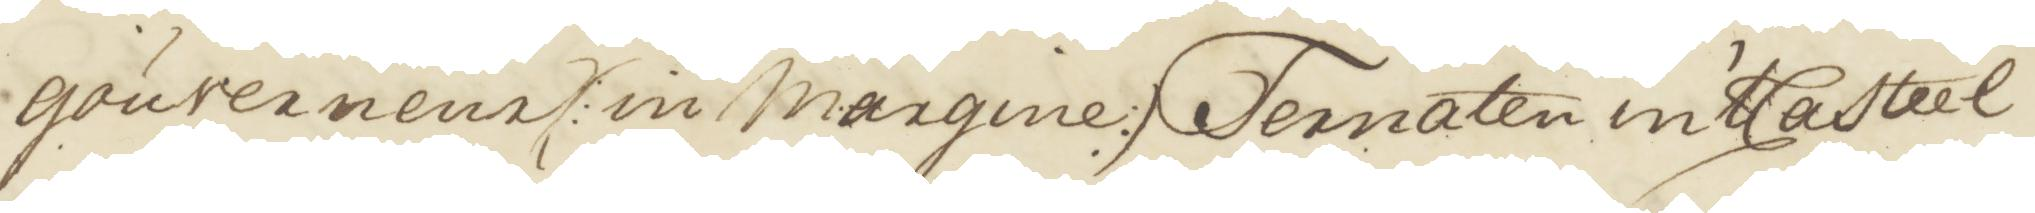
gouverneur (:in margine:) Ternaten in 'tCasteel
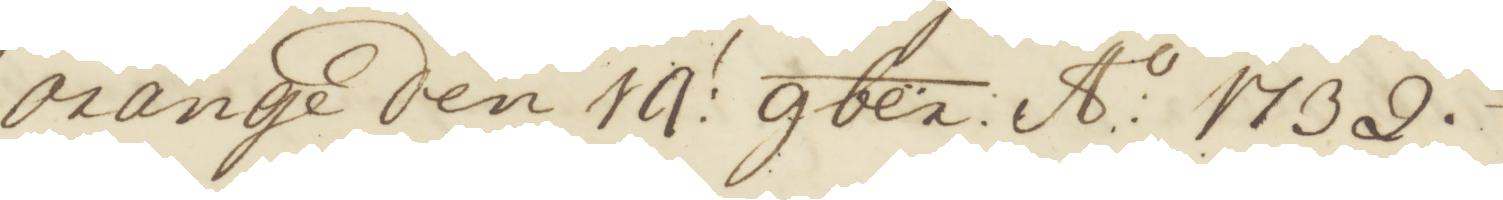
orange den 14:' 9ber: A:o 1732.
